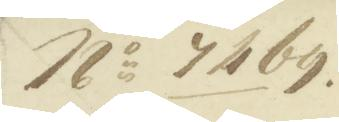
N=o 7469.
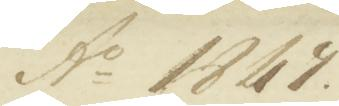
A=o 1847.
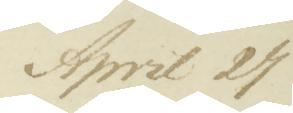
April 27.
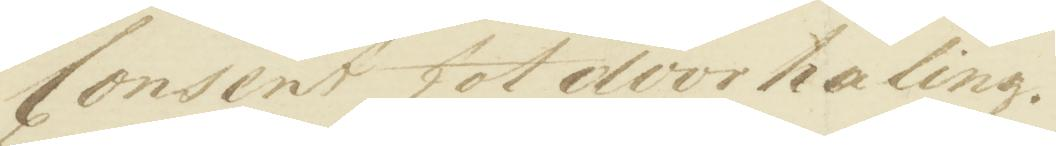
Consent tot doorhaling.
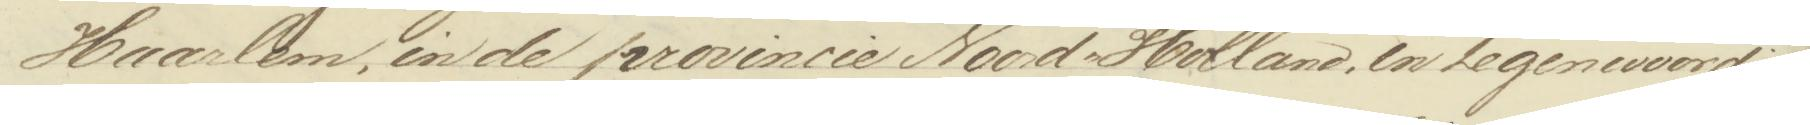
Haarlem, in de provincie Noord, Holland, in tegenwoordig
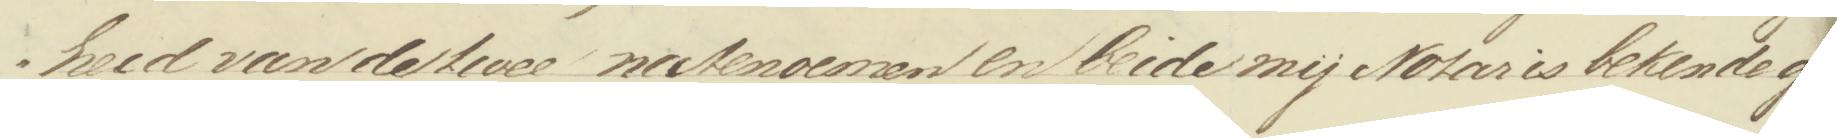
„heid van de twee natenoemen en beide mij Notaris bekende ge
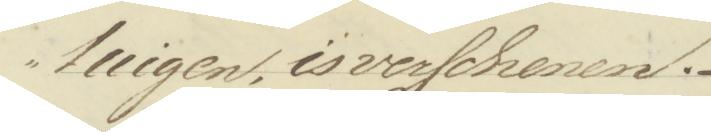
„tuigen, is verschenen.
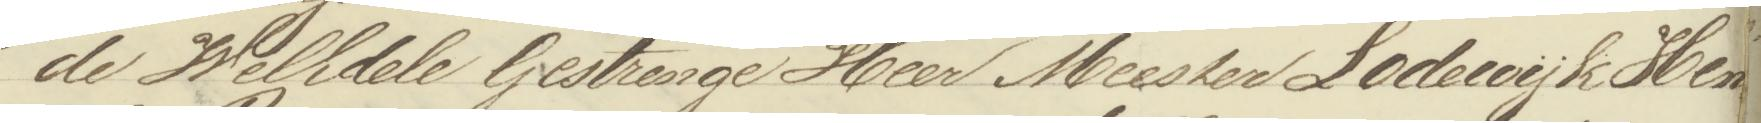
de WelEdele Gestrenge Heer Meester Lodewijk Hen
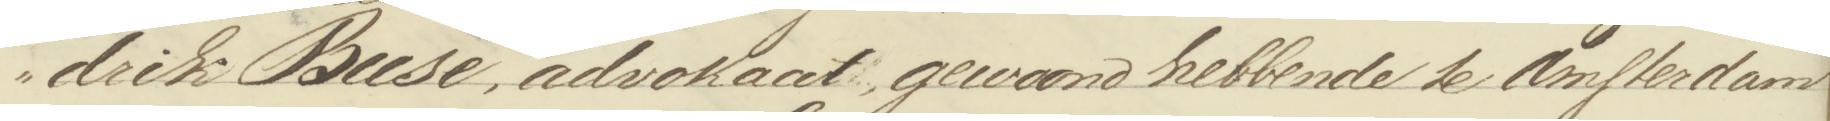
„drik Buse, advokaat, gewoond hebbende te Amsterdam
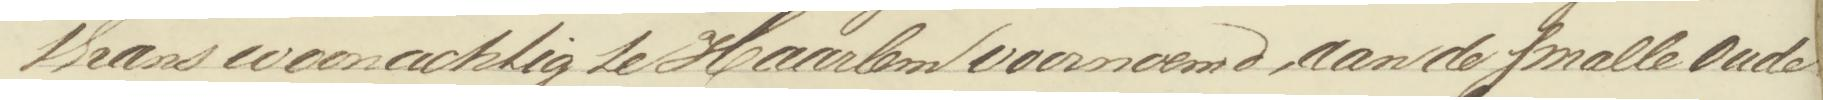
thans woonachtig te Haarlem voornoemd, aan de smalle oude
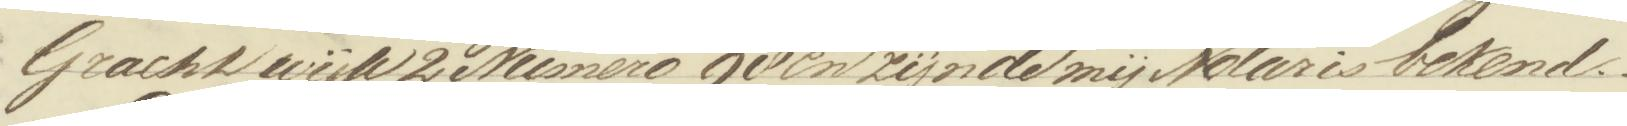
Gracht wijk 2 Numero 98 en zijnde mij Notaris bekend.
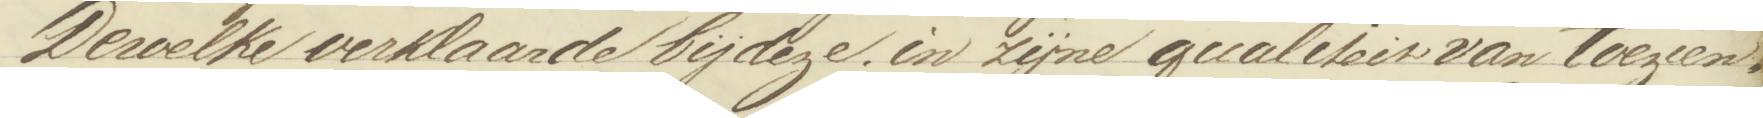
Dewelke verklaarde bij deze, in zijne qualiteit van toezien
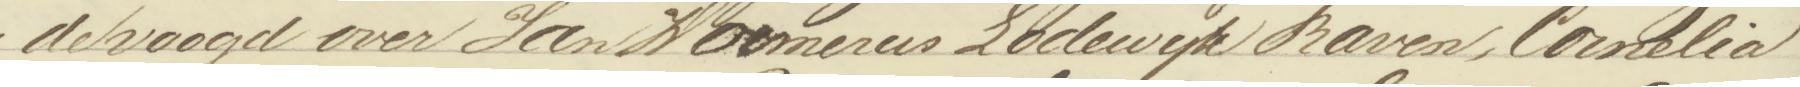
de voogd over Ian Wormerus Lodewyk Raven, Cornelia
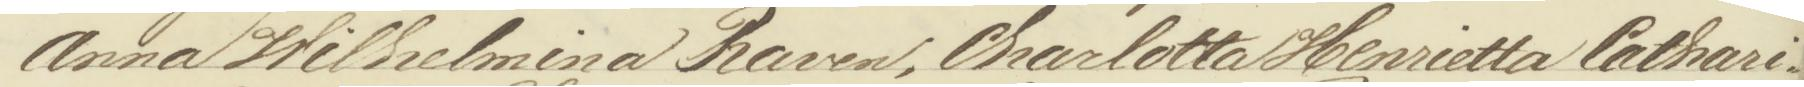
Anna Wilhelmina Raven, Charlotta Henrietta Cathari„
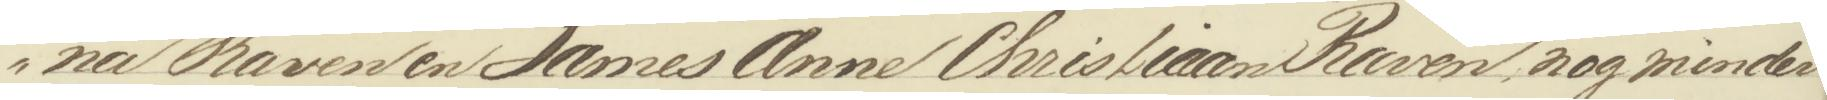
„na Raven en James Anne Christiaan Raven, nog minder
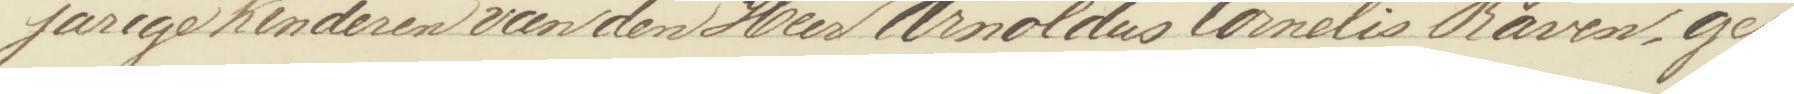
jarige kinderen van den Heer Arnoldus Cornelis Raven, ge
